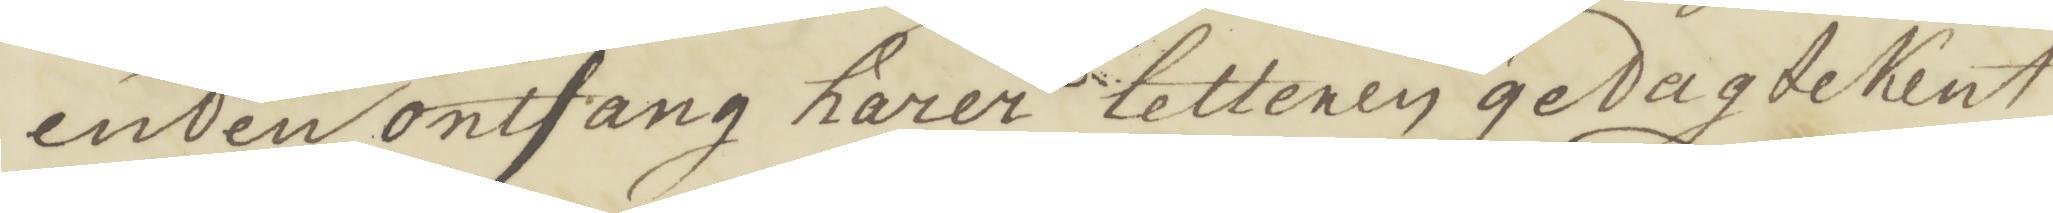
en den ontfang harer letteren gedagdekent
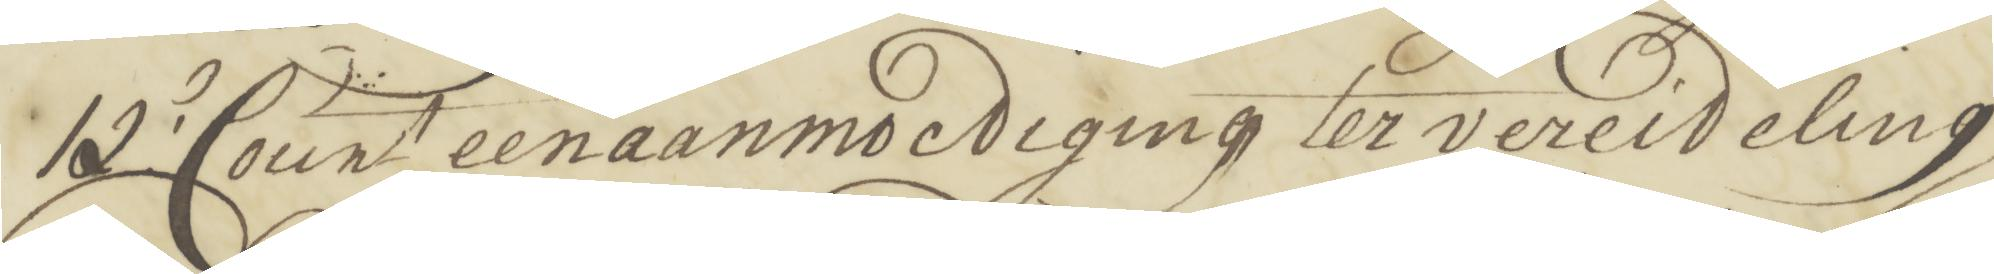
12:' Cour:t een aanmoediging ter vereideling
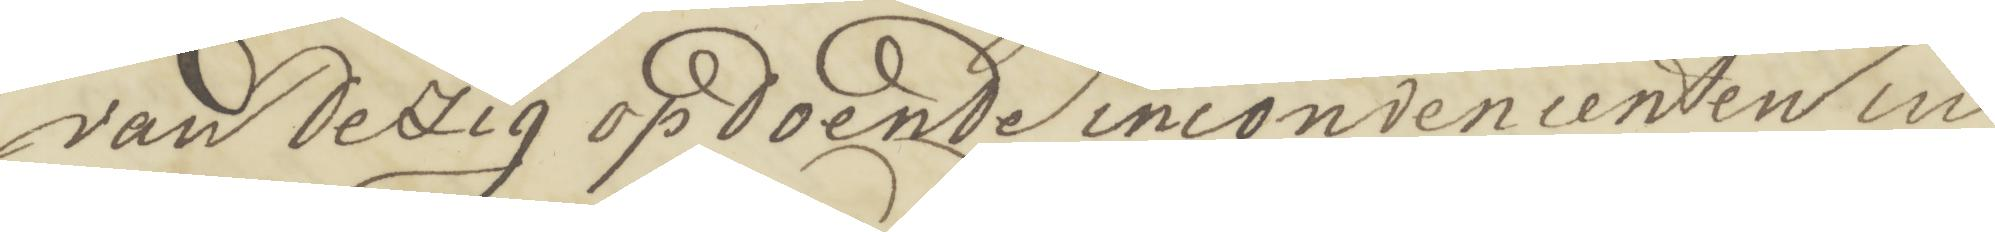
van de zig op doende inconvenienten in
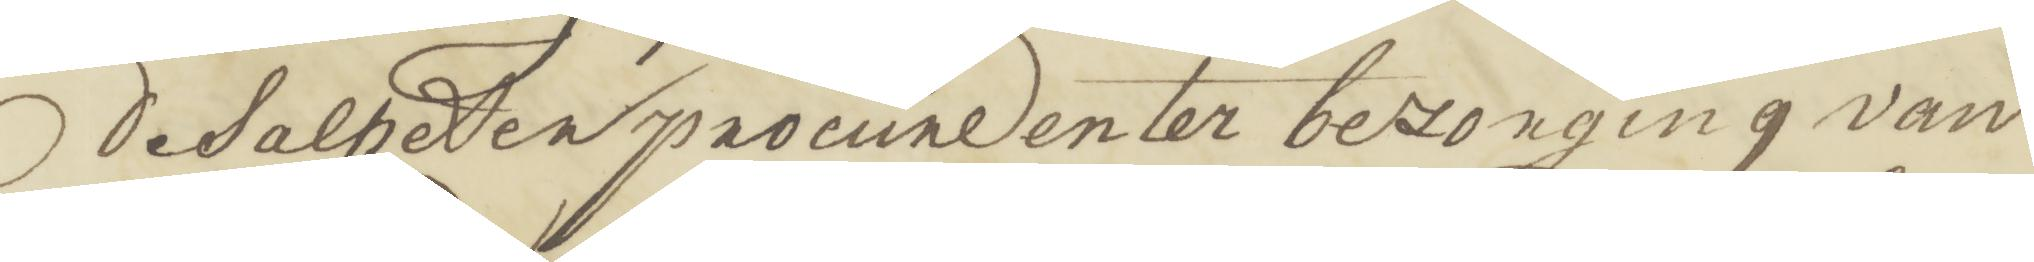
de Salpeter procure en ter bezorging van
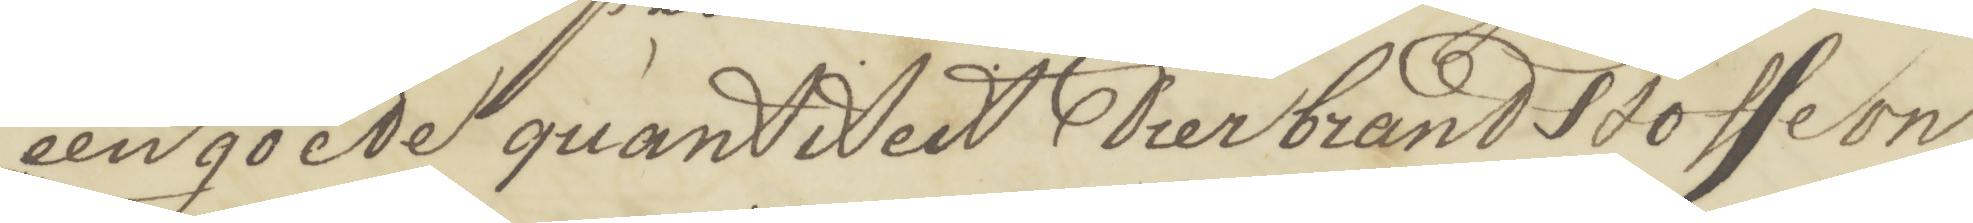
een goede quantiteit dier brandstoffe on
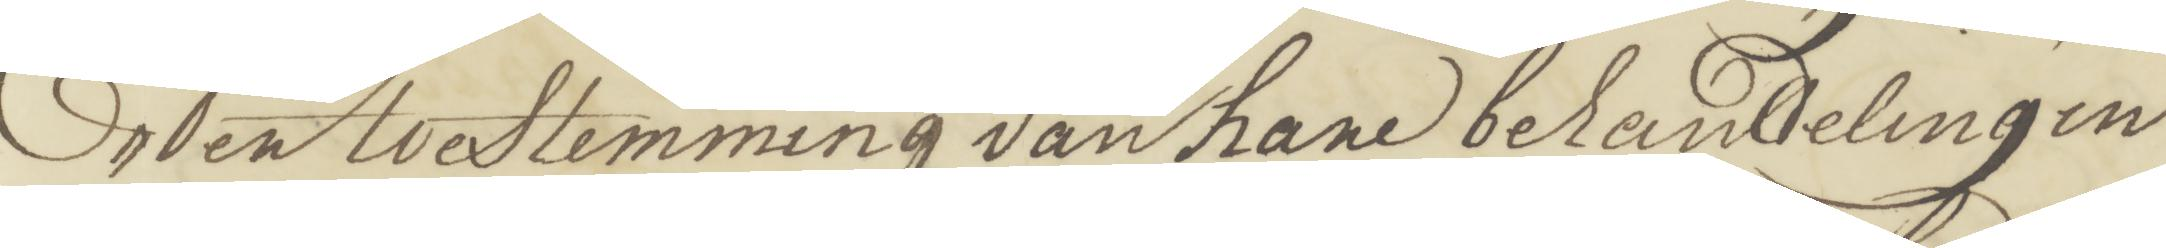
der toestemming van hare behandelingen
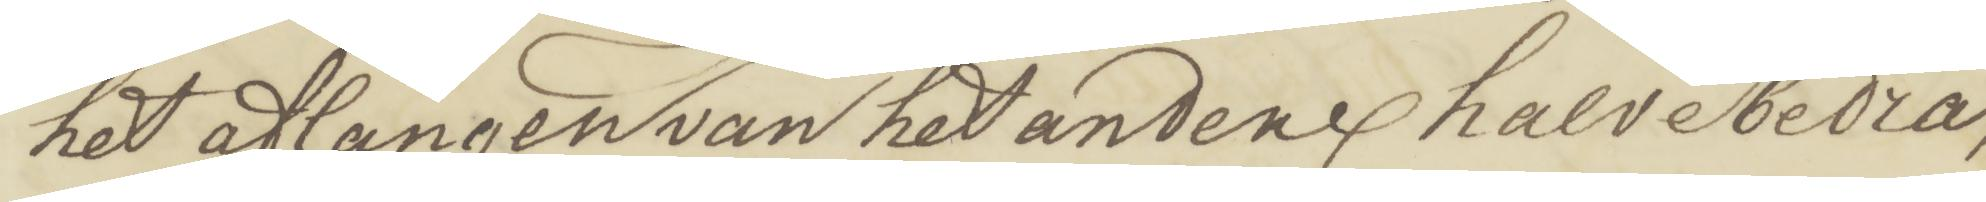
het aflangen van het andere halve bedra
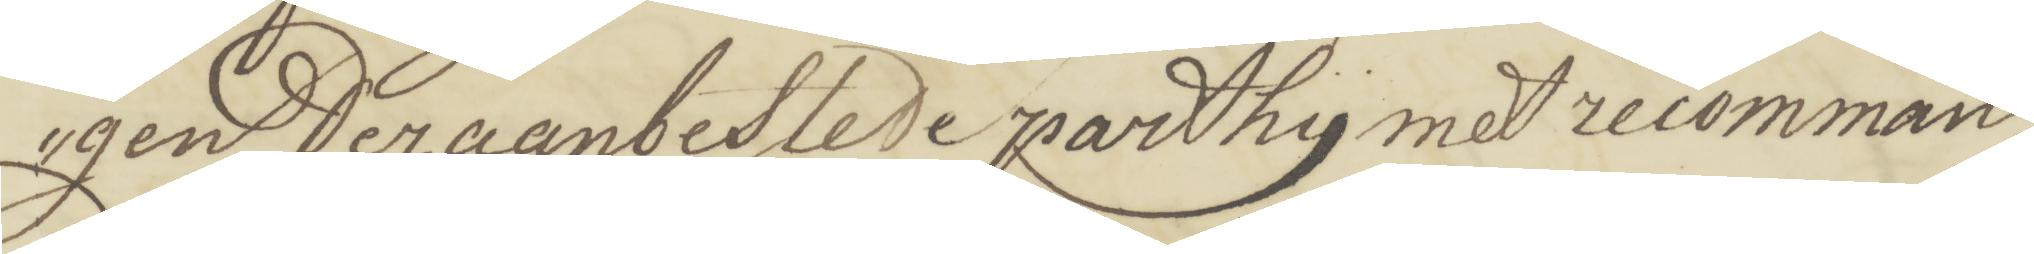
„gen der aanbestede parthij met recomman
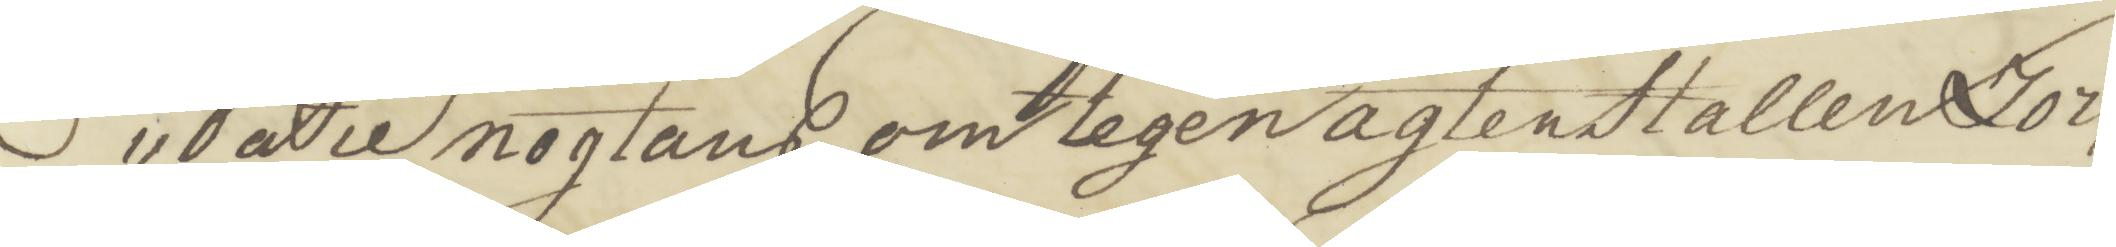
„datie nogtans om tegen agterstallen Zor„
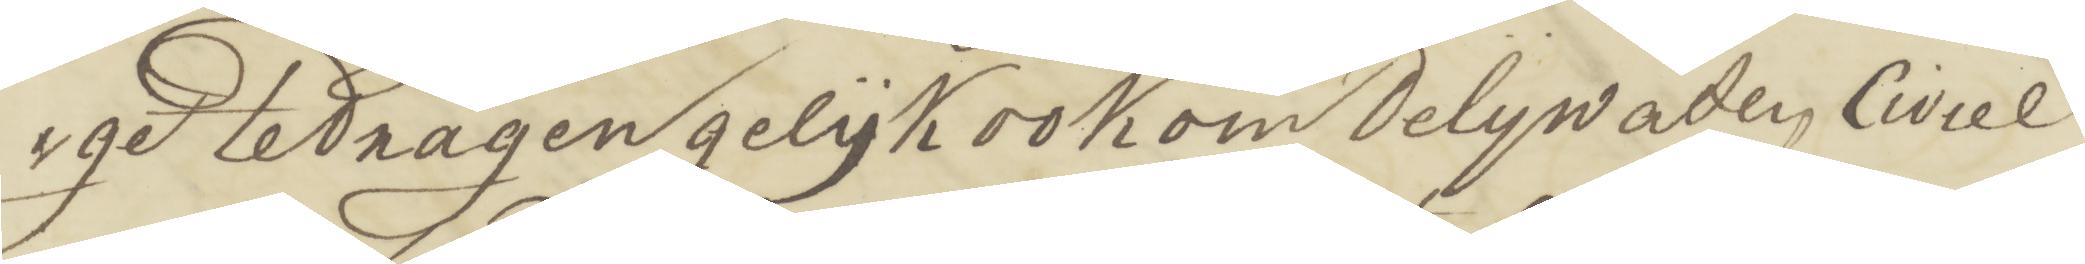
ge tedragen gelijk ook om de lijwaten Civiel
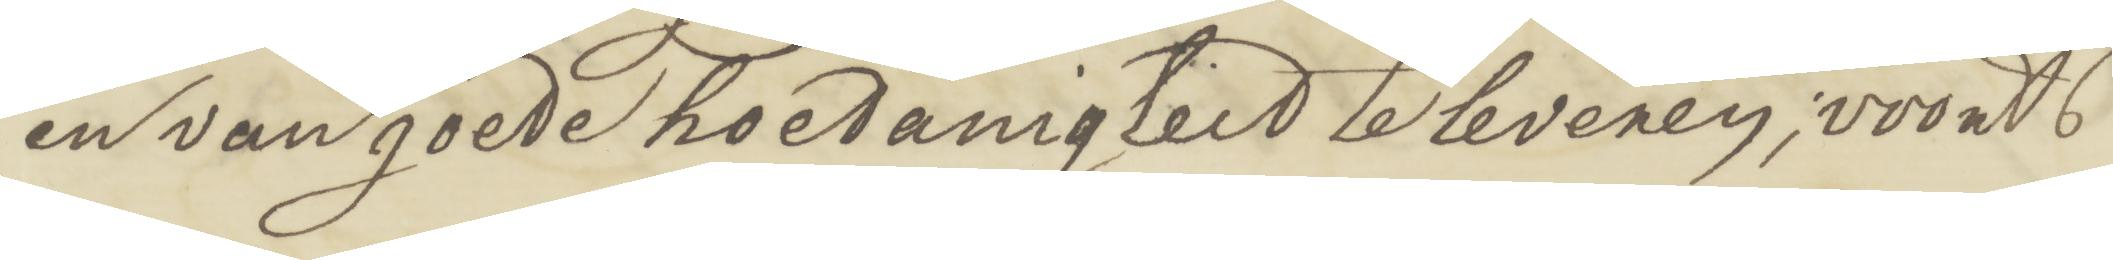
en van goede hoedanigheid te leveren; voorts
